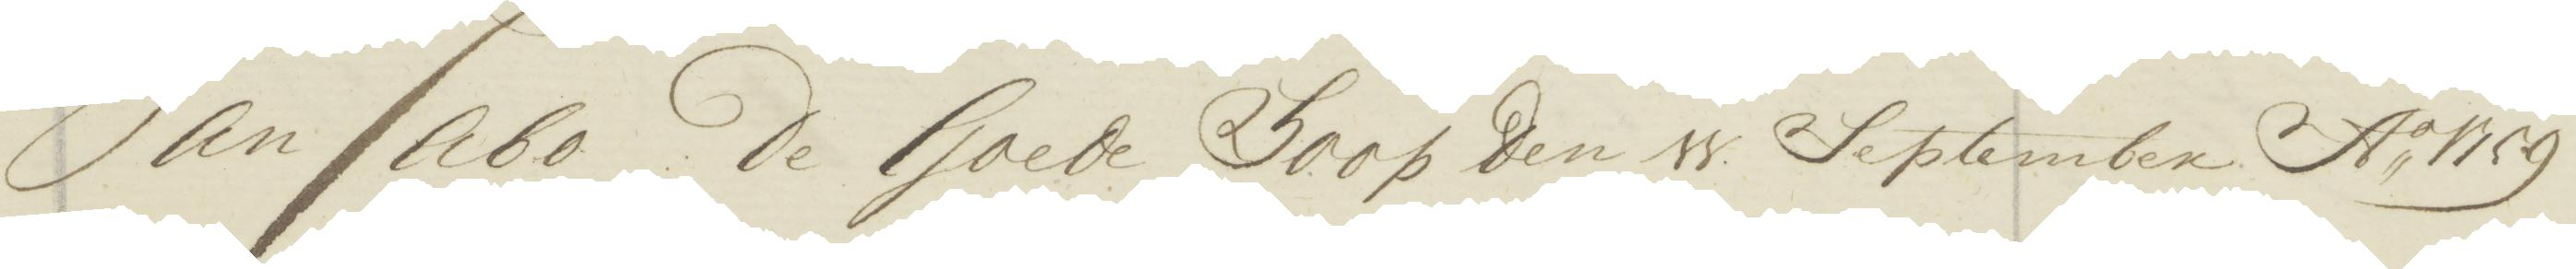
Van Cabo de Goede Hoop den 11: september A„o 1759
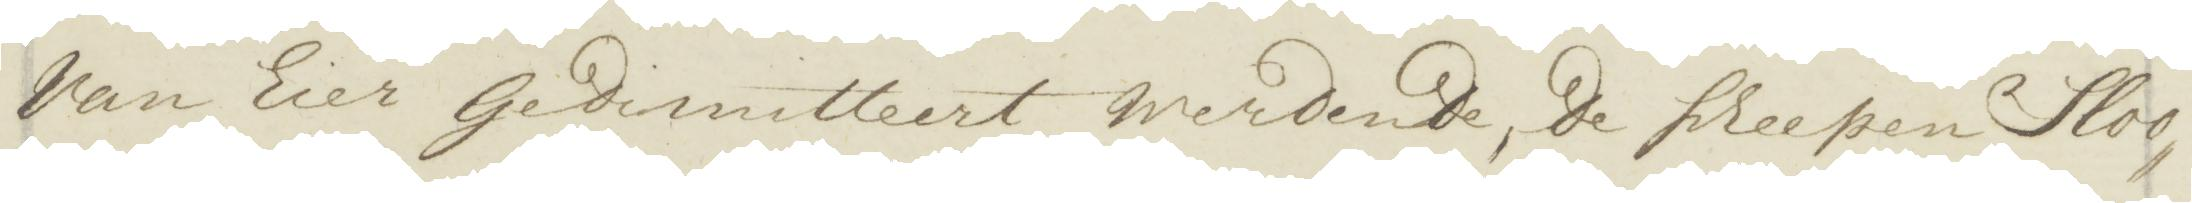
van hier gedimitteert werdende, de scheepen Hoo„
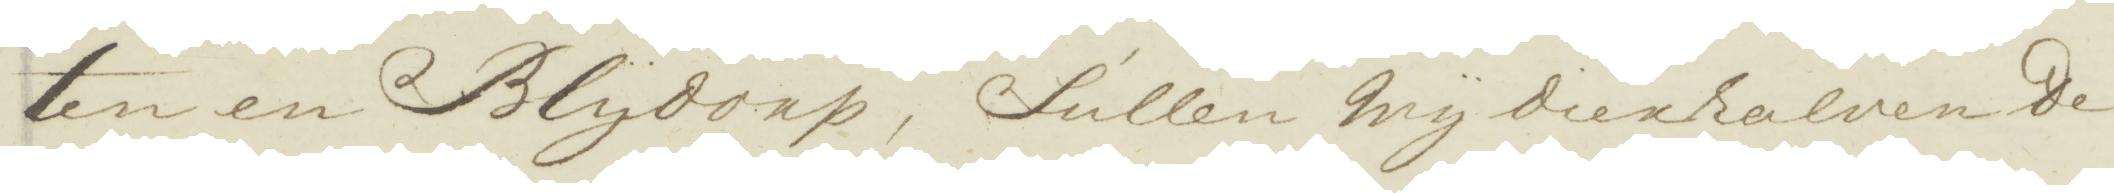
ten en Blijdorp, sullen wij dierhalven de
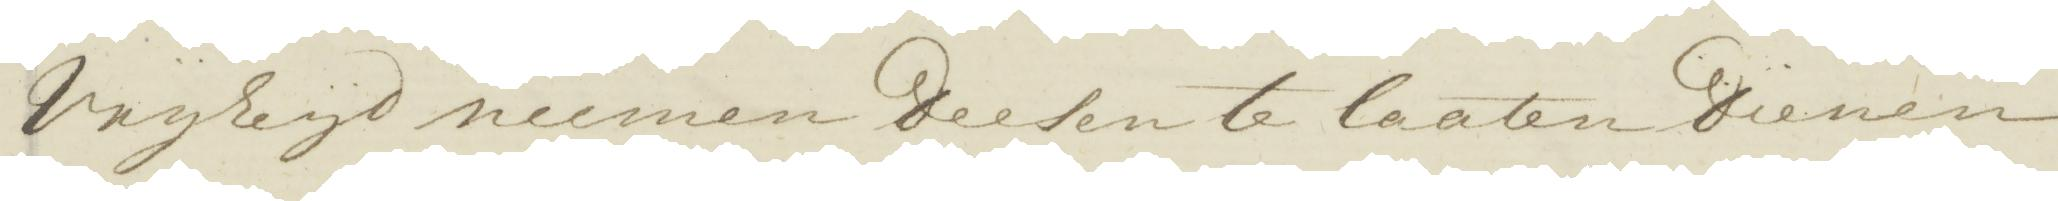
vrijheijd neemen deesen te laaten dienen
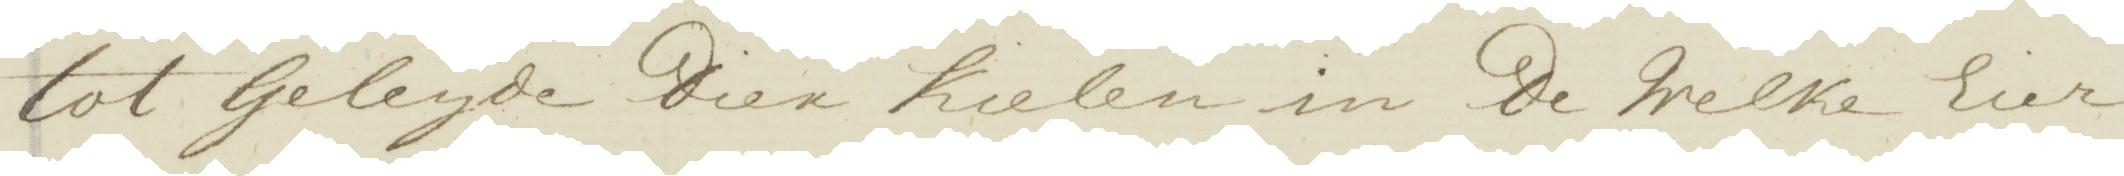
tot geleijde dier kielen in de welke hier
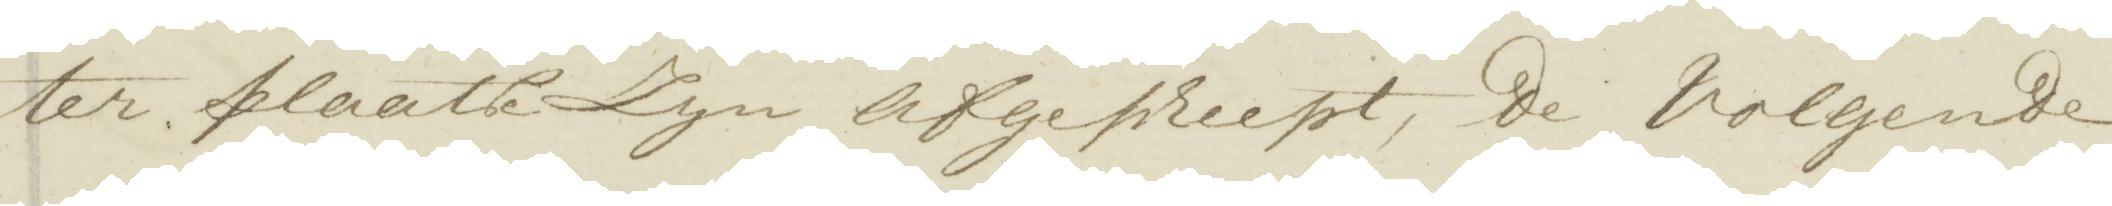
ter plaatse zijn afgescheept, de volgende
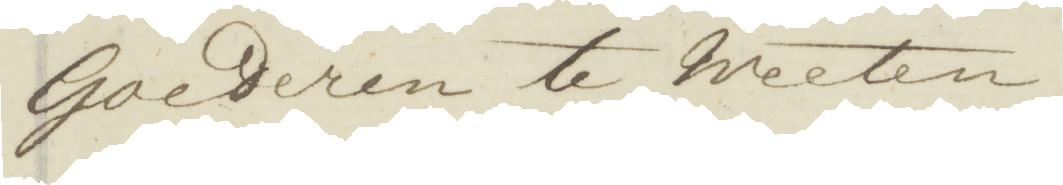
Goederen te weeten
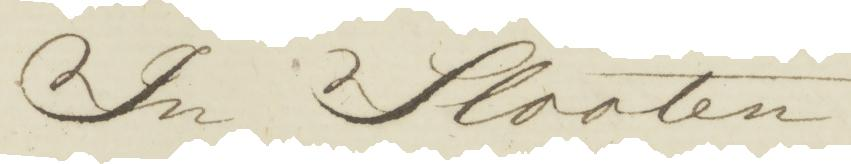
In Slooten
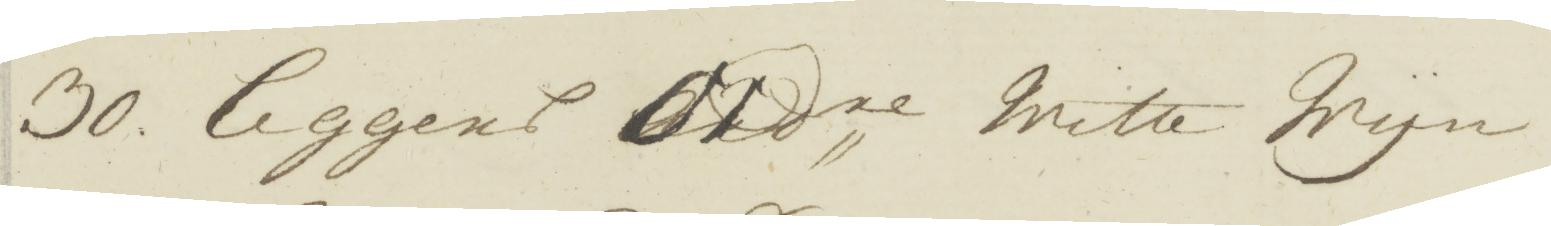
30. leggers Ord„re witte wijn
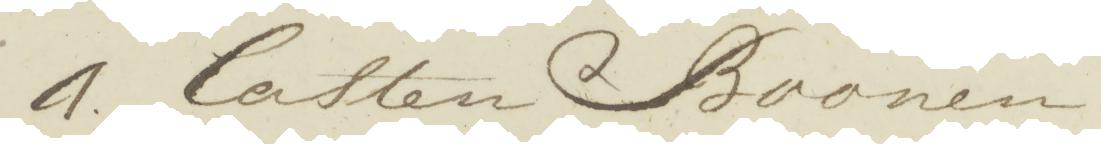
4. lasten Boonen
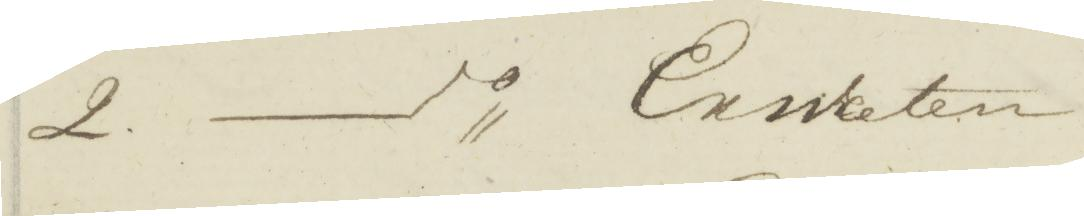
2. _„o Erweeten
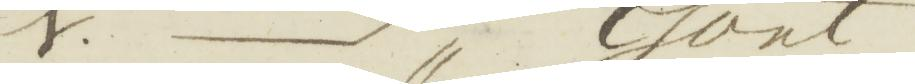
1. _„o Gort
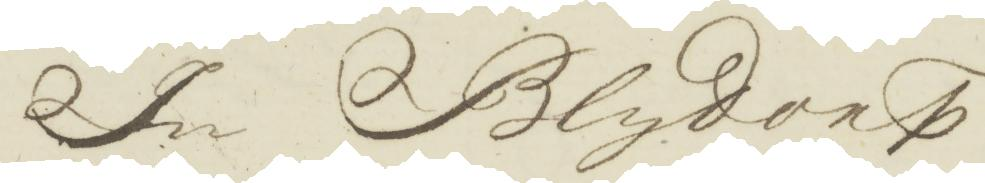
In Blydorp
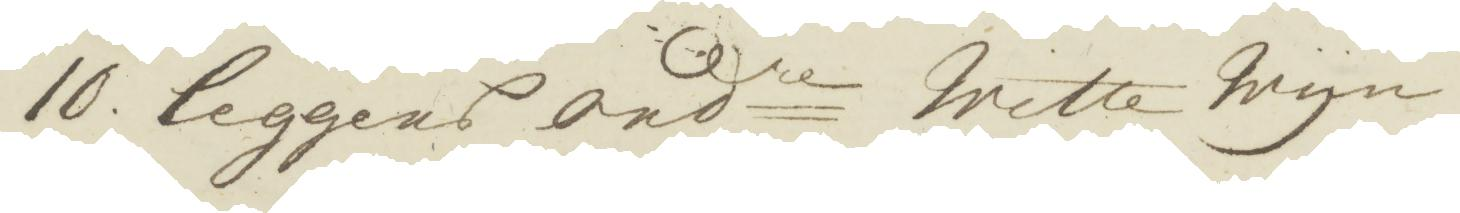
10. leggers ord=re witte wijn
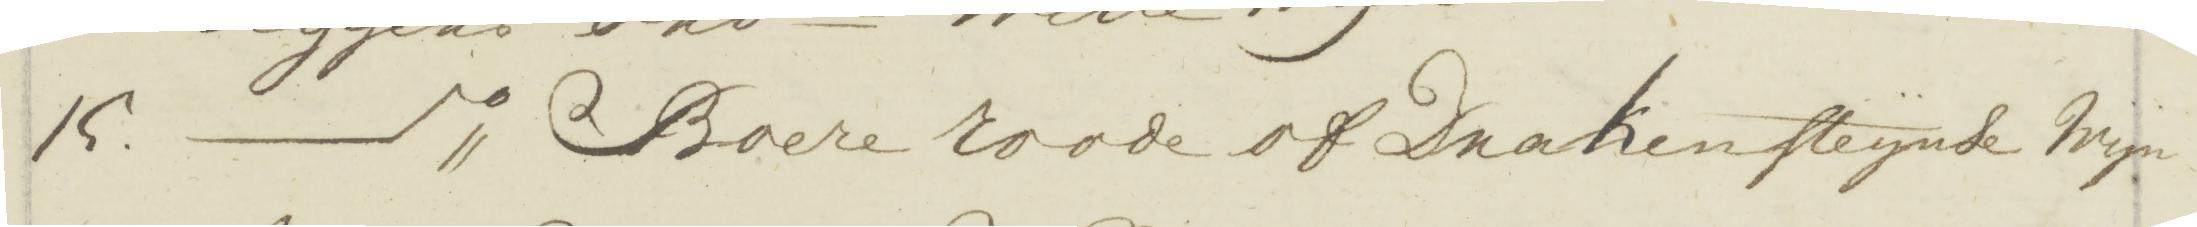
15. _„o Boere roode of Drakensteijnse wijn
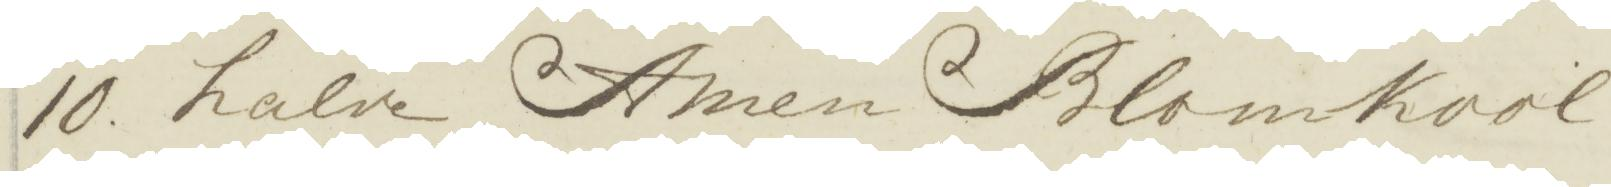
10. halve Amen Blomkool
